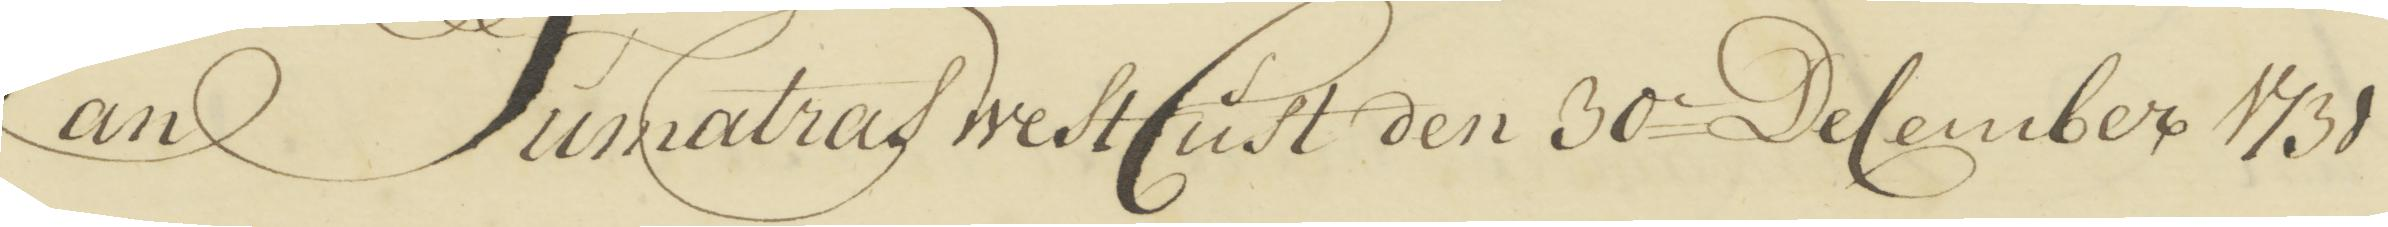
Van Sumatras West Cust den 30=e December 1738
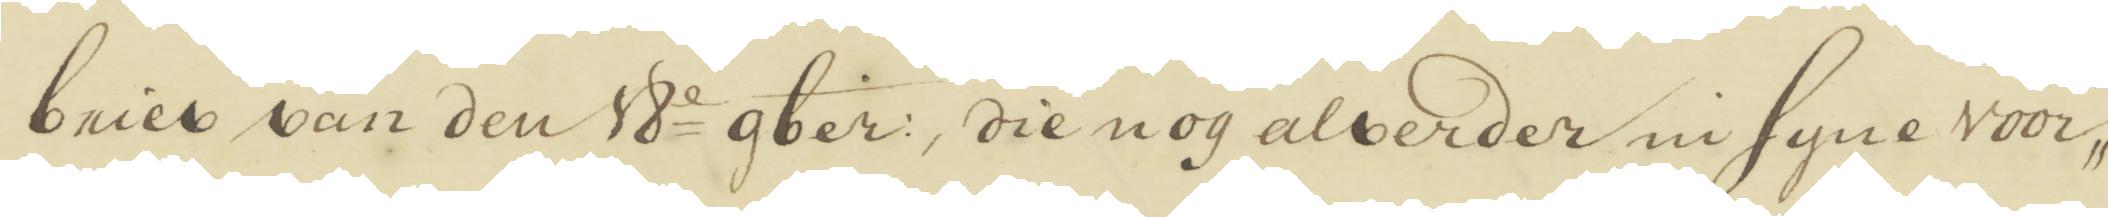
briev van den 18=e 9ber:, die nog alverder in syne voor„
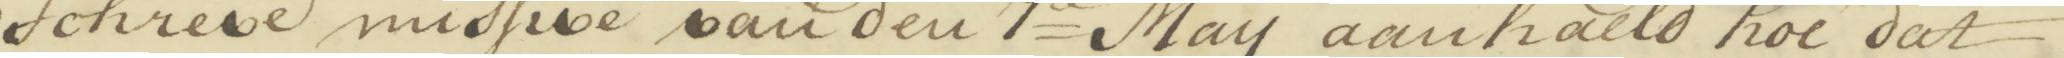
schreve missive van den 7=e Maij aanhaeld hoe dat
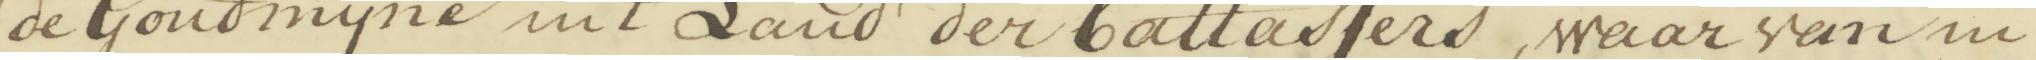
de Goudmijne in’t Land der battassers, waar van in
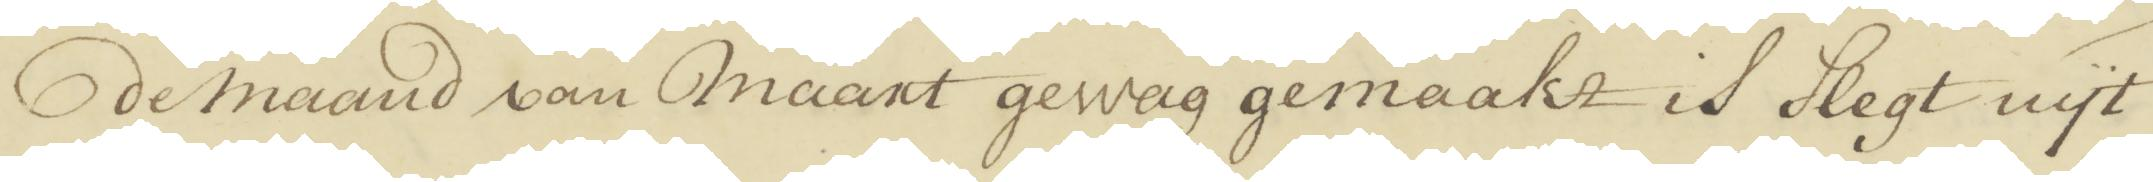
de maand van Maart gewag gemaakt is slegt uijt
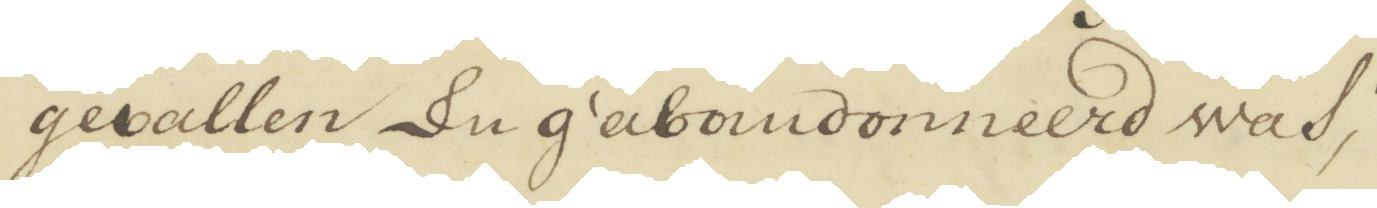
gevallen En g’abandonneerd was;
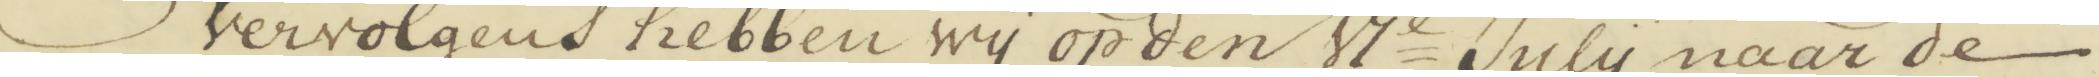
Vervolgens hebben wij op den 17=e Julij naar de
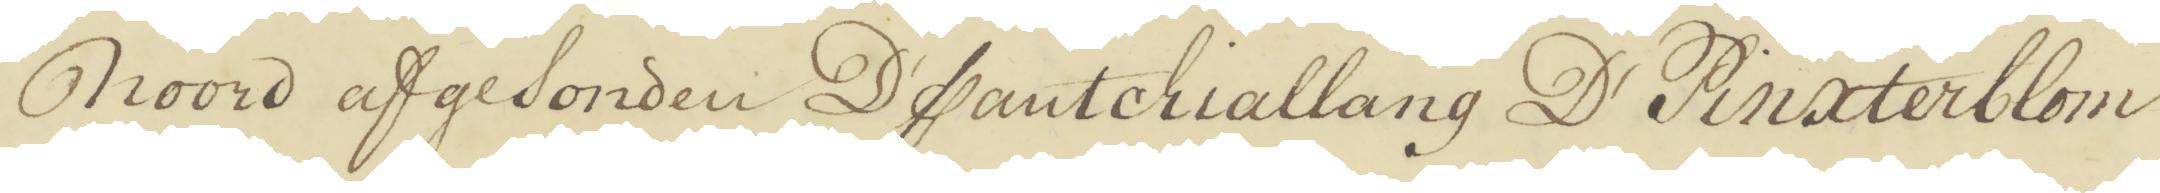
noord afgesonden D' Pantchiallang D' Pinxterblom
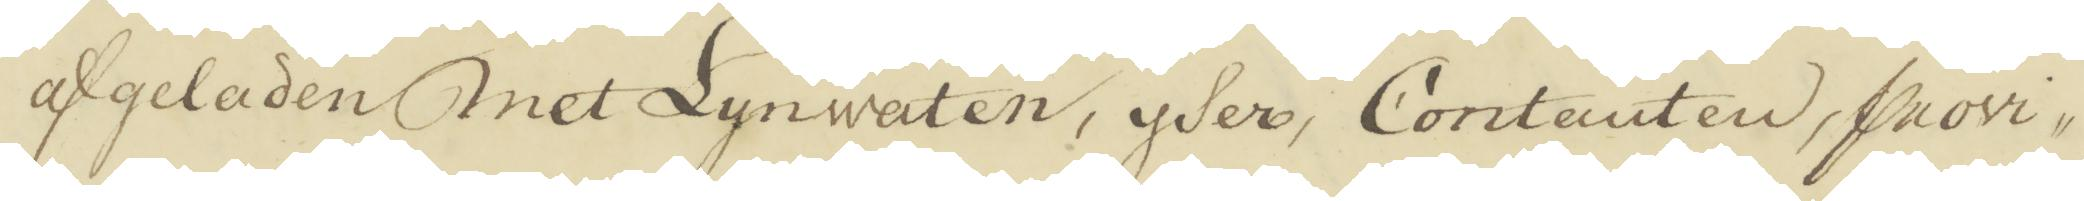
afgeladen met Lynwaten, yser, Contanten, Provi„
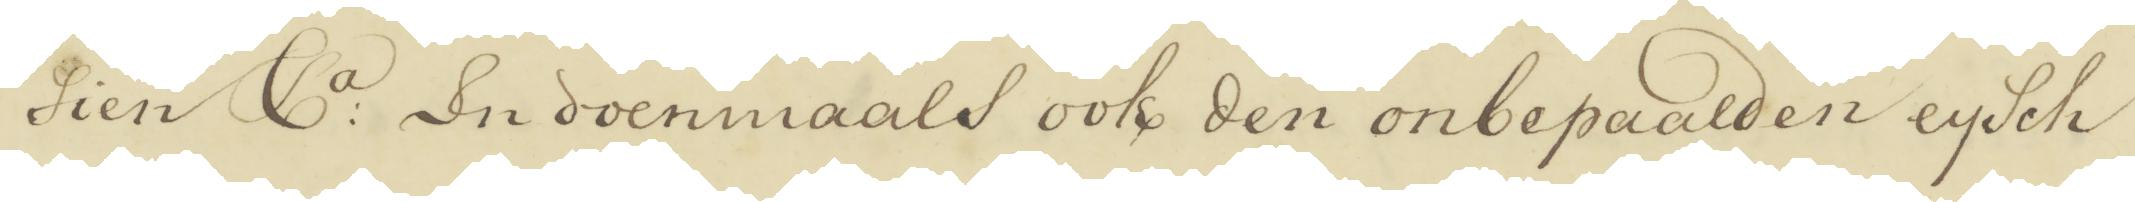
sien &:a En doenmaals ook den onbepaalden eysch
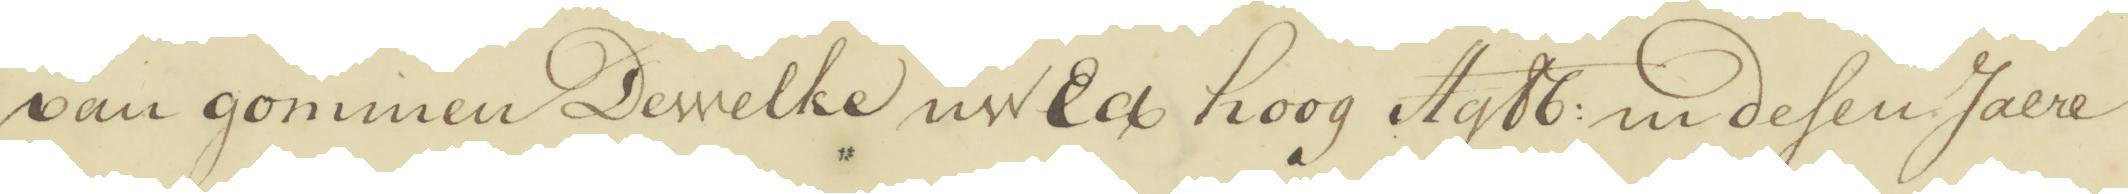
van gommen Dewelke uw Ed hoog Agtb: in desen Jaere
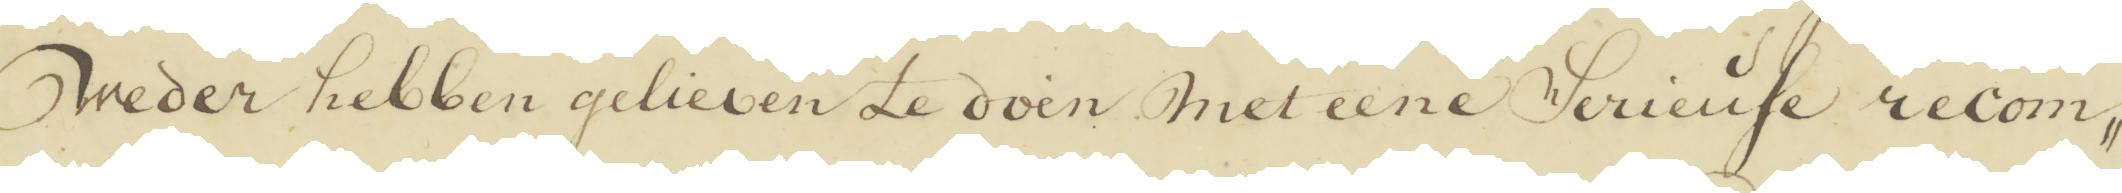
weder hebben gelieven te doen met eene Serieuse recom„
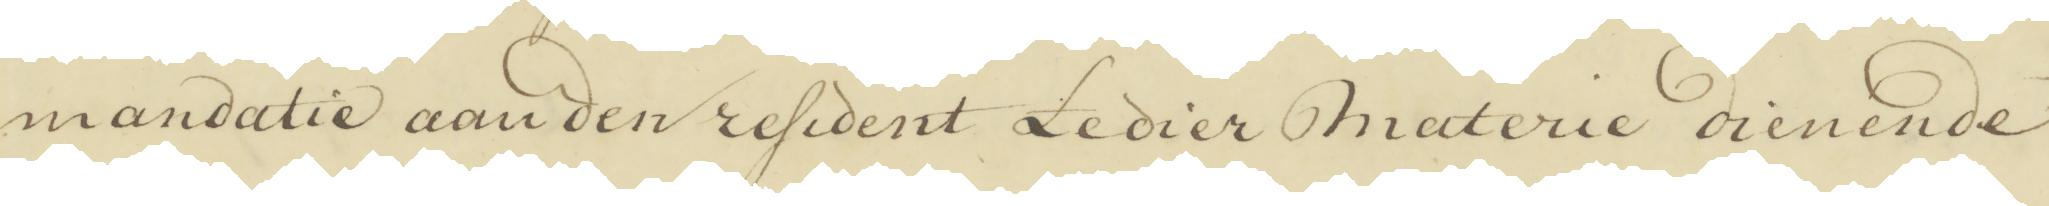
mandatie aan den resident te dier materie dienende
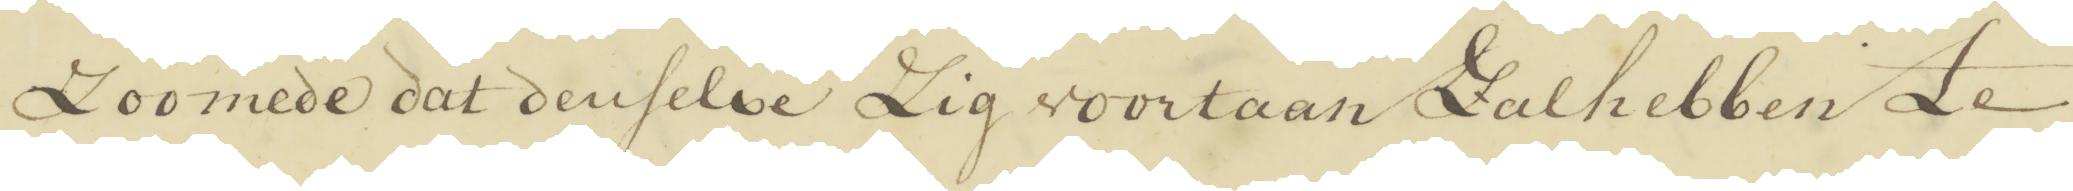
zoo mede dat denselve zig voortaan Zalhebben te
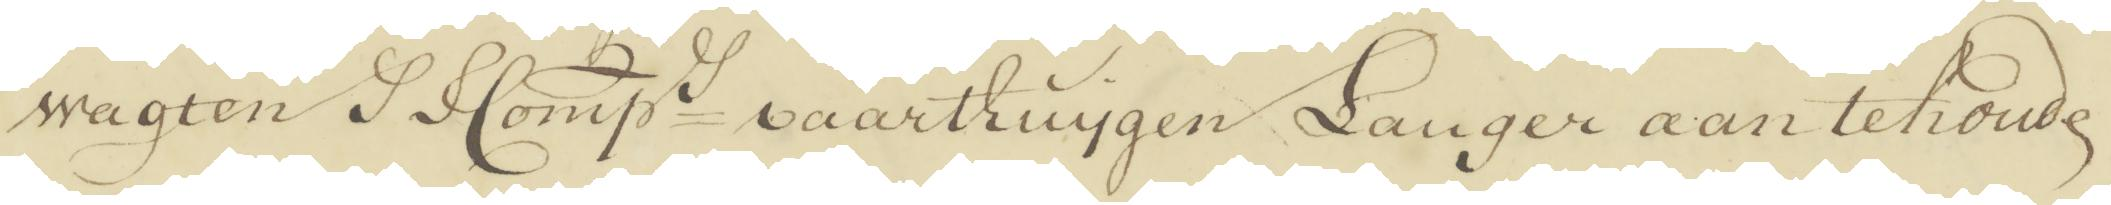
wagten s EComp=s vaarthuijgen Langer aan te houden
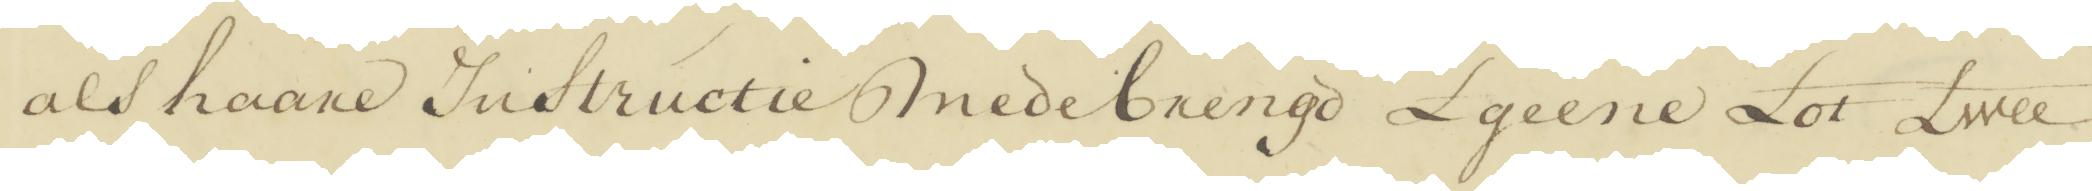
als haare Instructie medebrengd 't geene tot twee
